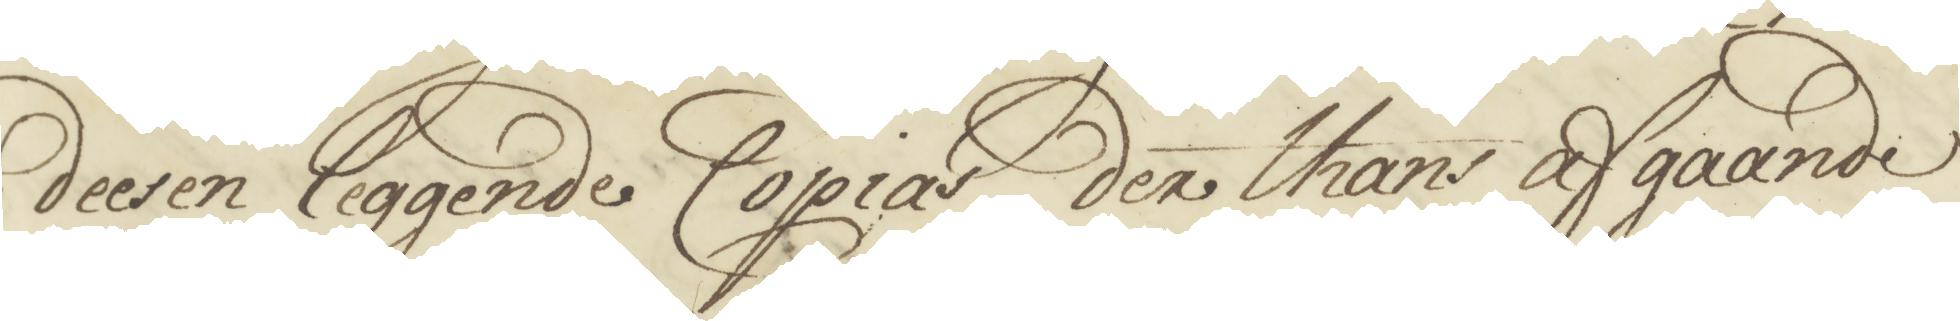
deesen leggende Copias der thans afgaande
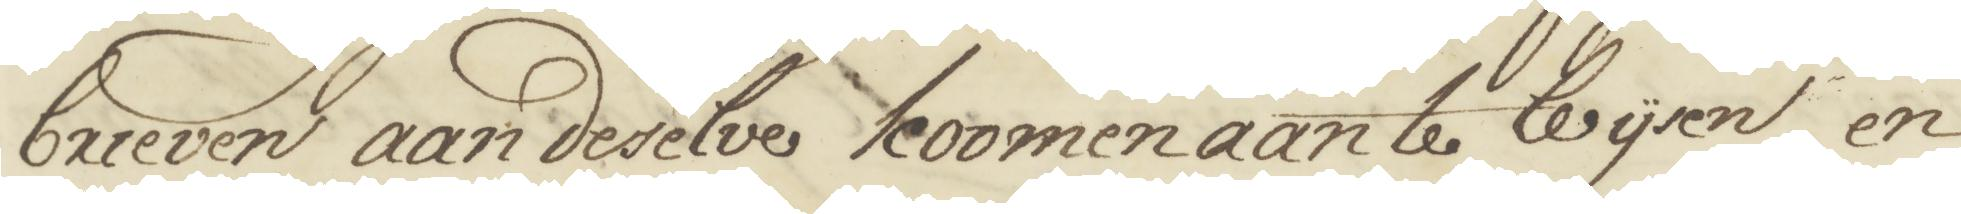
brieven aan deselve koomen aan te Eijsen, en
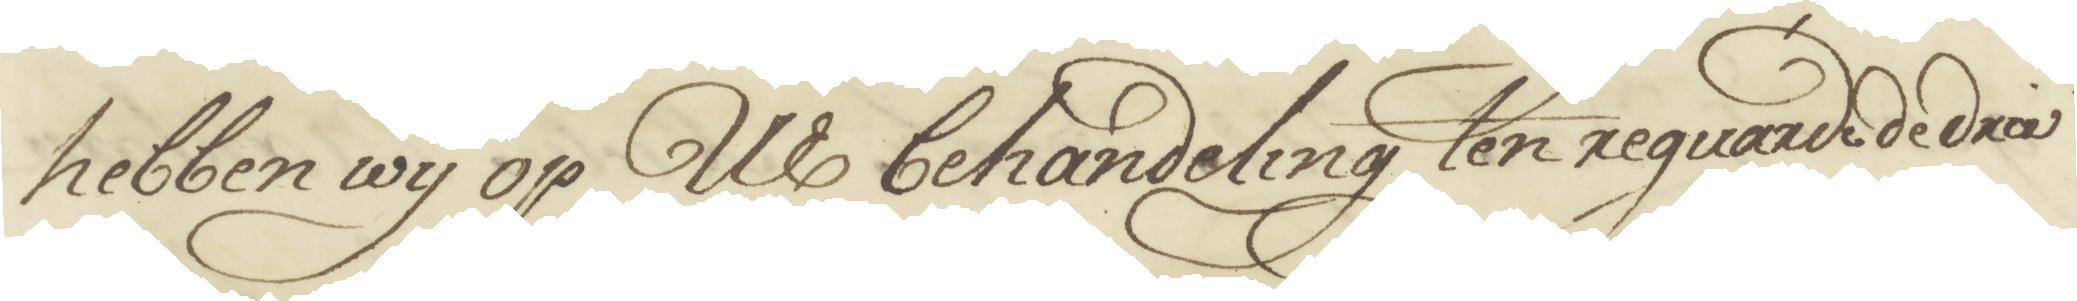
hebben wy op UE behandeling ten reguarde de drie
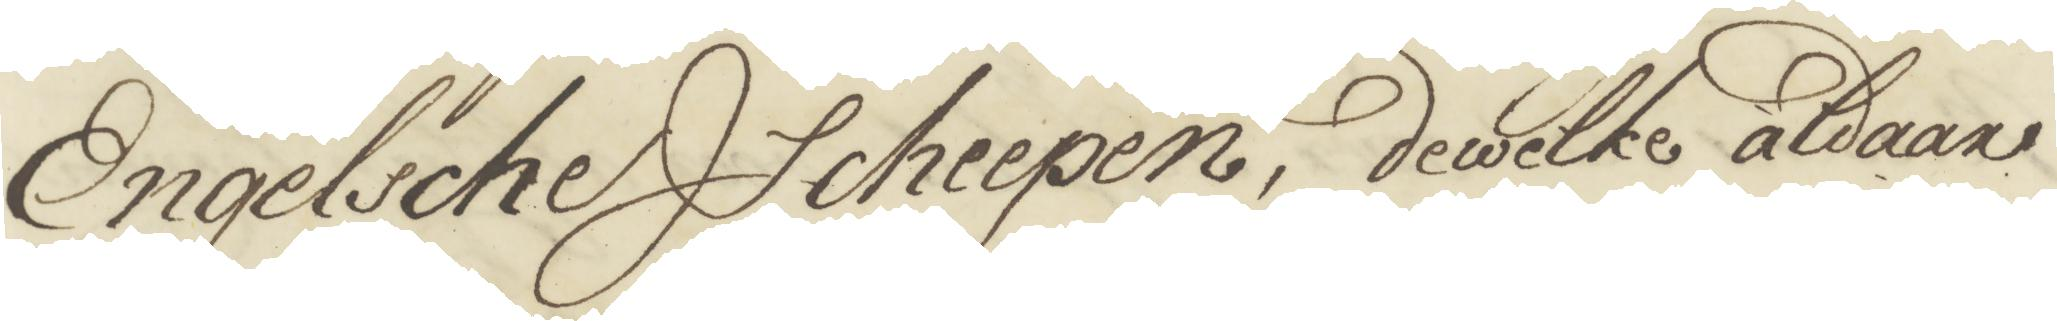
Engelsche scheepen, dewelke aldaar
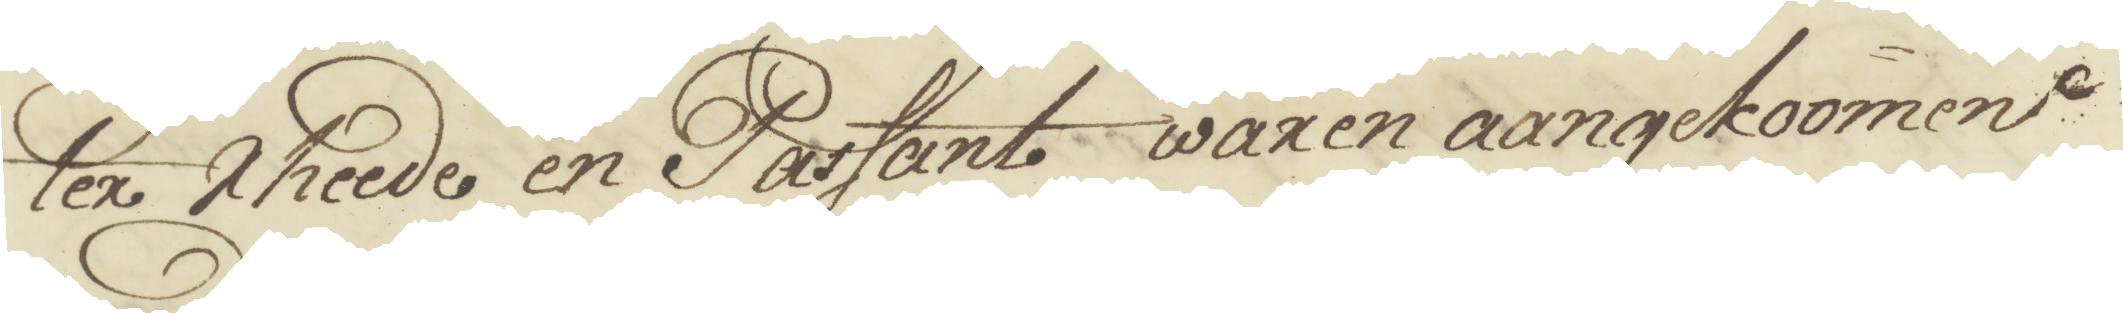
ter rheede en Passant waren aangekoomen
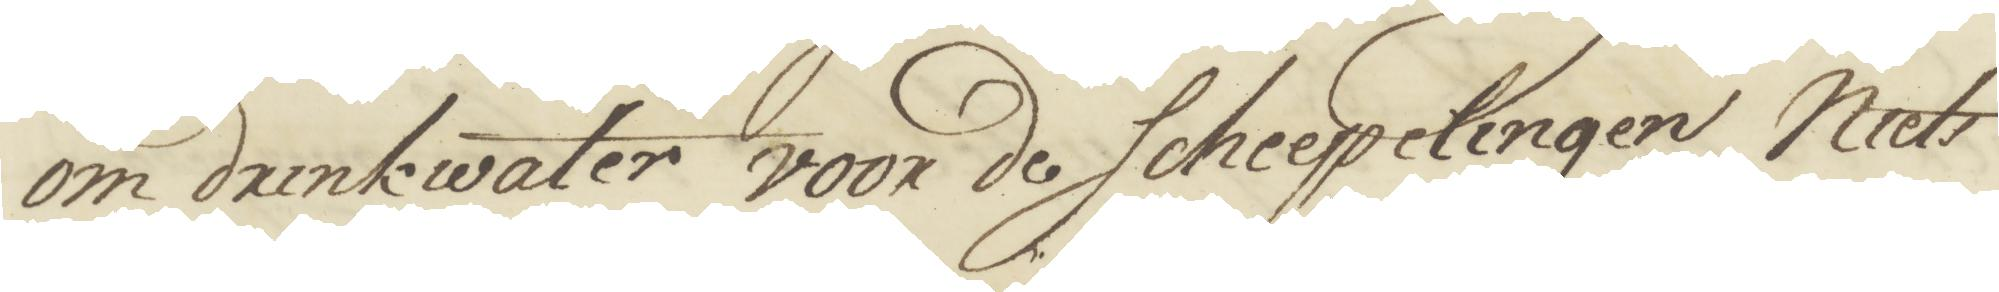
om drinkwater voor de scheepelingen niets
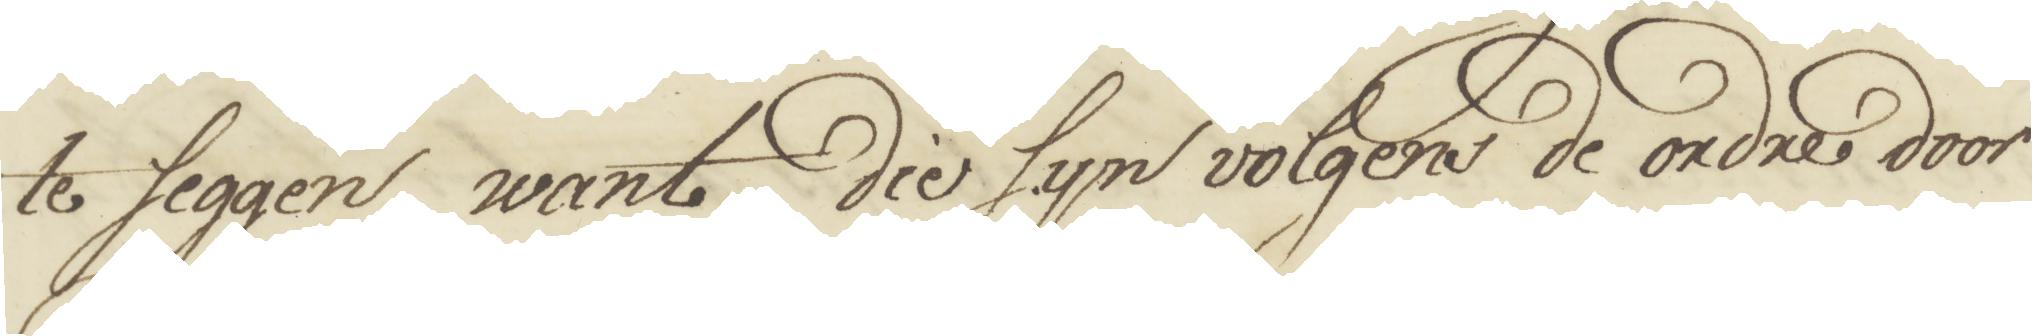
te seggen, want die syn volgens de ordre door
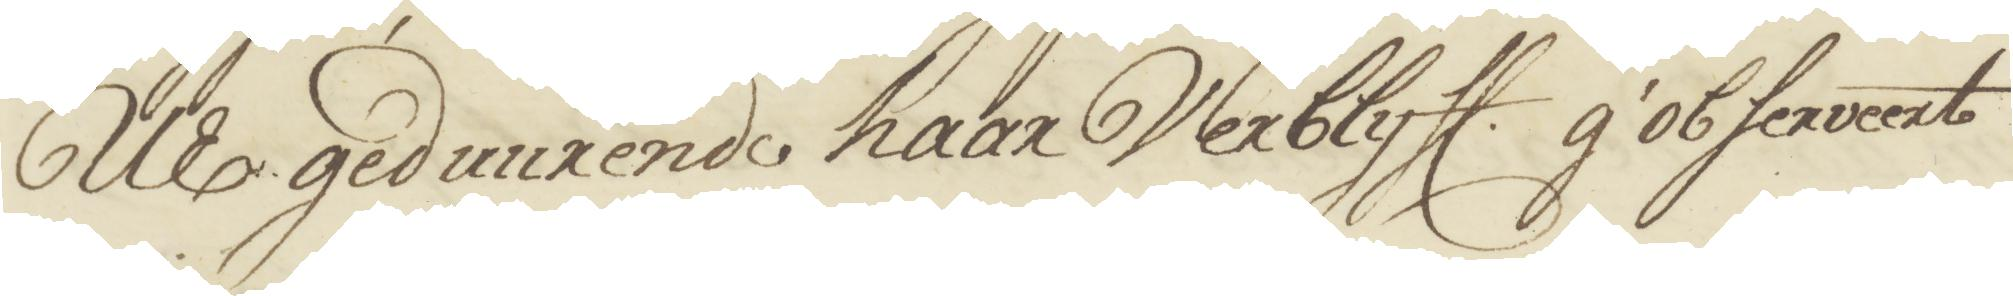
UE geduurende haar Verblyf. g’observeert
